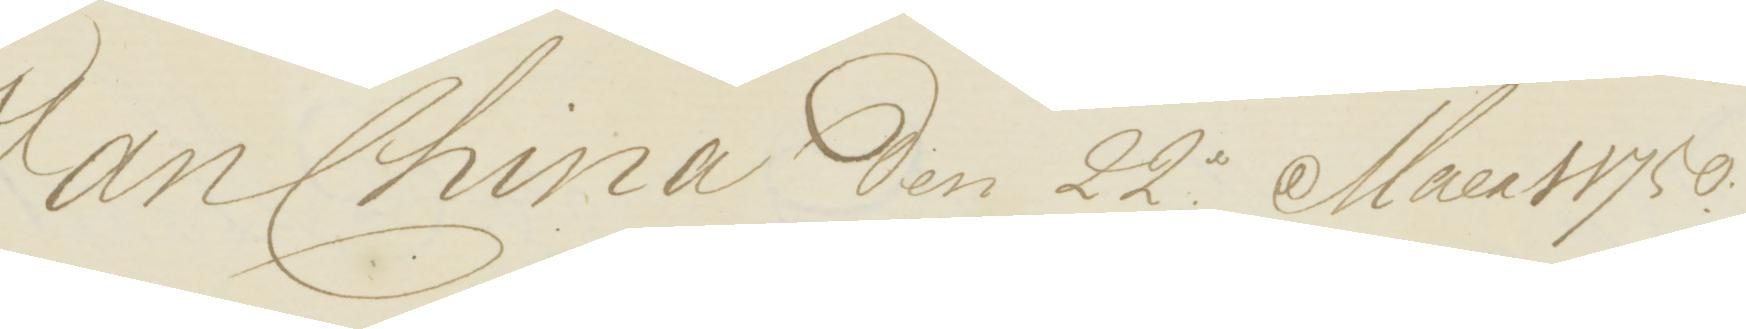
Van China den 22:e Maert 1750:
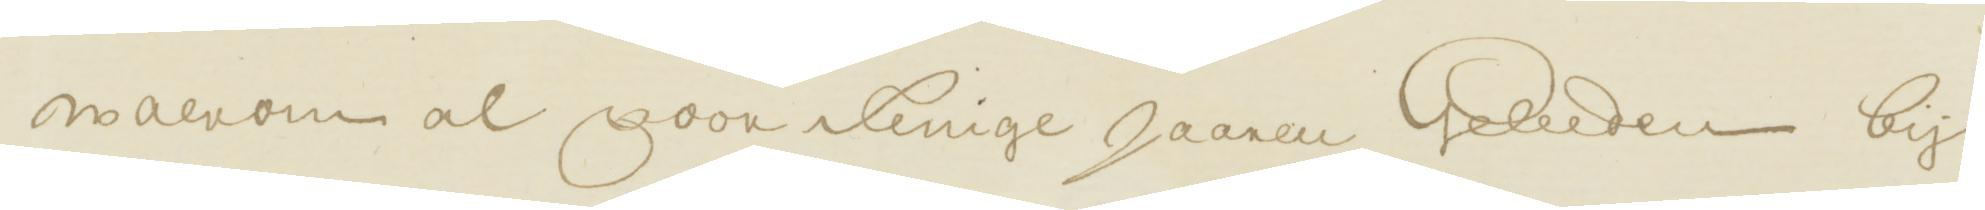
waerom al voor Eenige jaaren geleeden bij
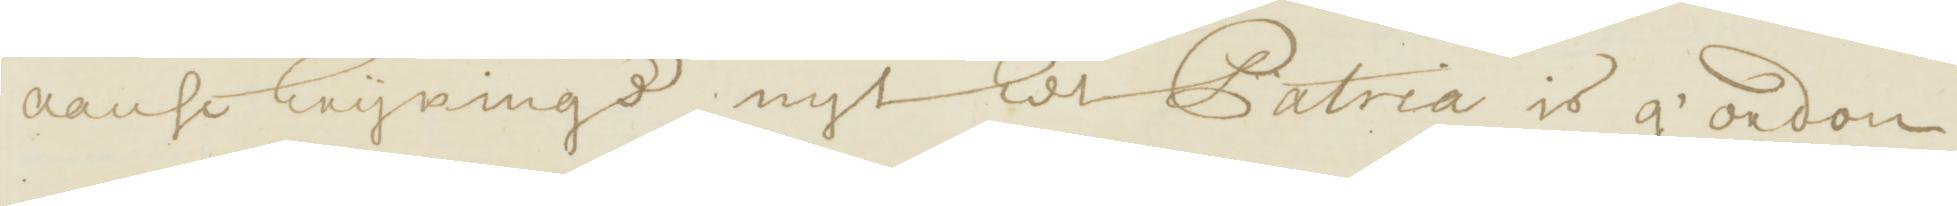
aanschrijvinge uyt het Patria is g’ordon
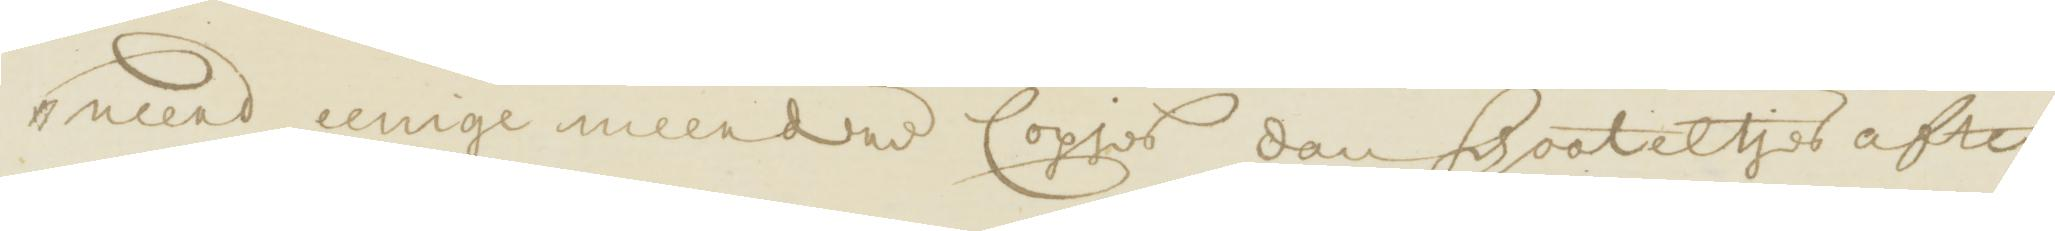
„neerd eenige meerdere Copjes dan schooteltjes afte
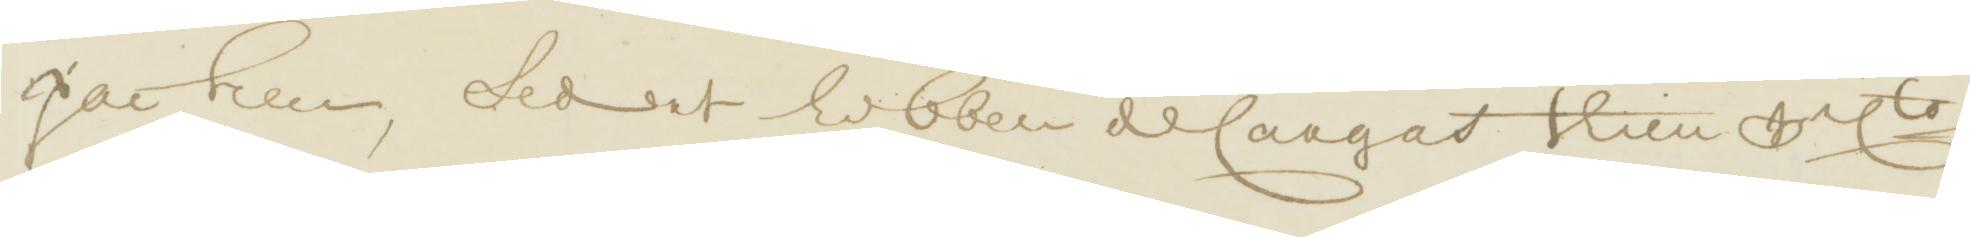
packen, sedert hebben de Cargas thien pr=t
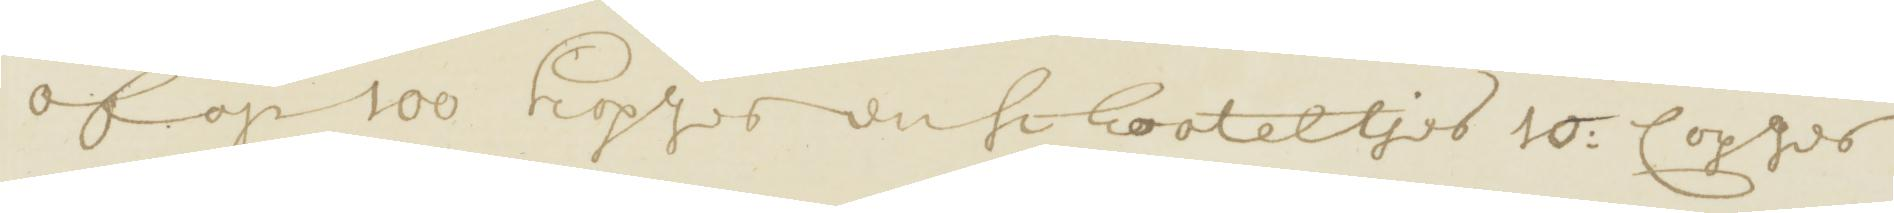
of op 100 kopjes en schooteltjes 10: Copjes
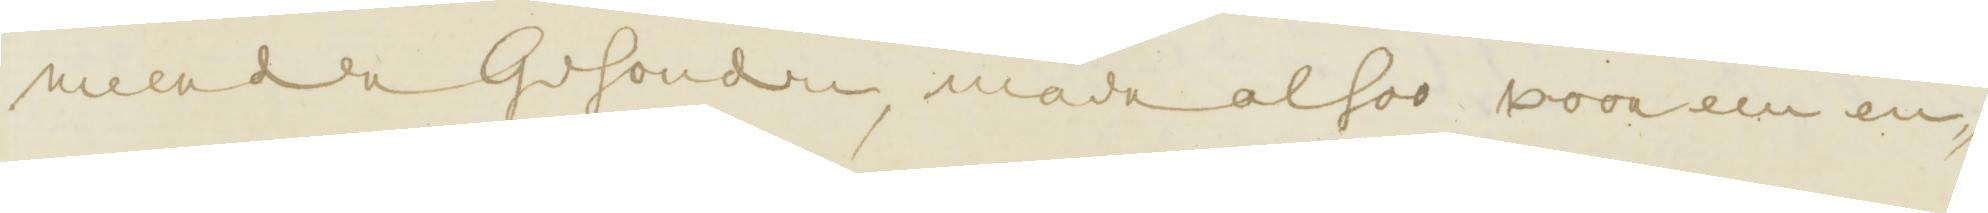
meerder gesonden, maer alsoo voor een en„
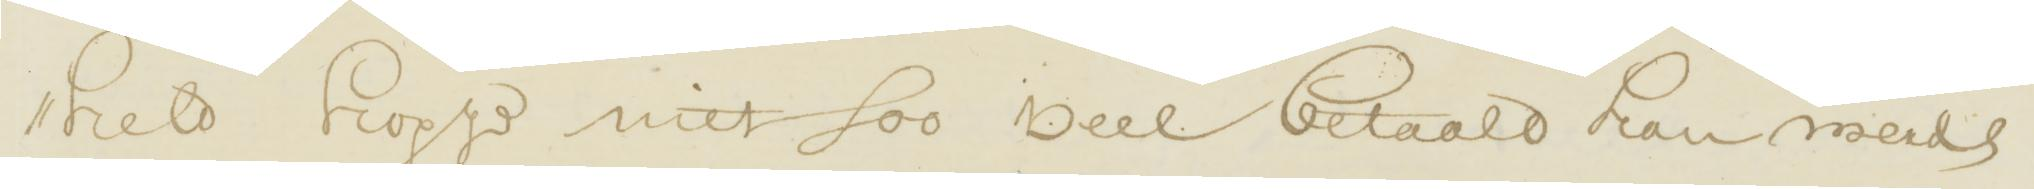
„keld kopje niet soo veel betaald kan werden
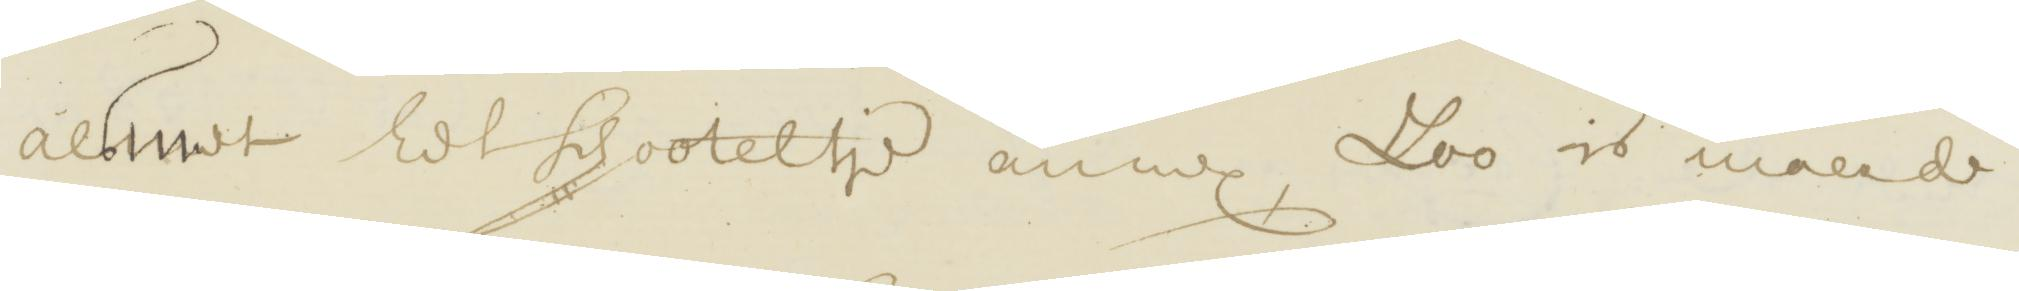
alsmet het schooteltje annex, zoo is maer de
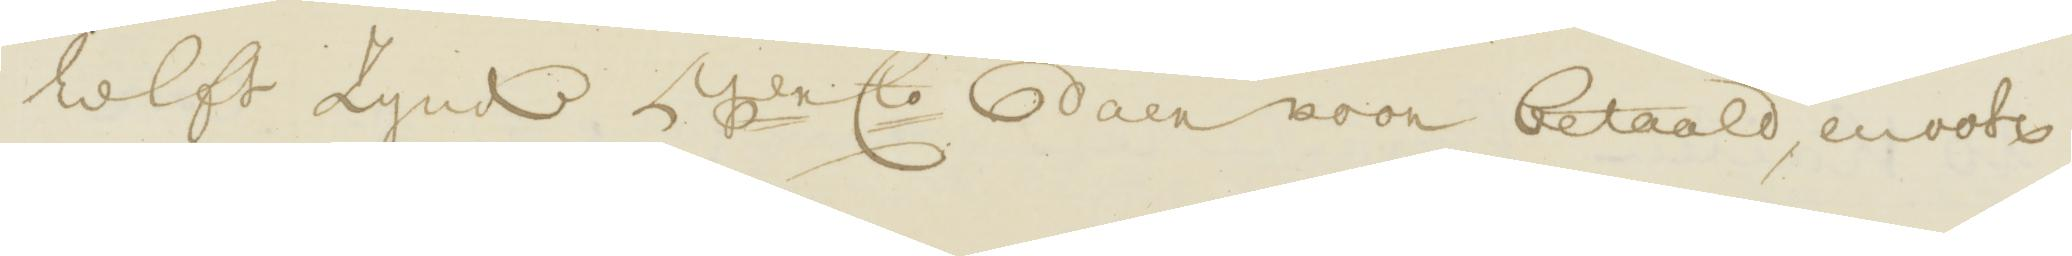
helft zynde 5 p=er C=to daer voor betaald, en ook
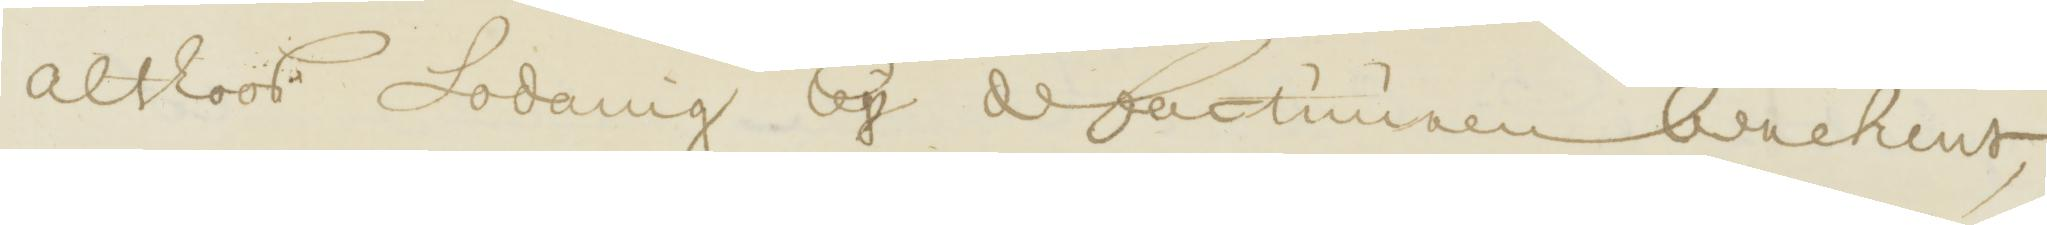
althoos sodanig bij de factuuren berekent,
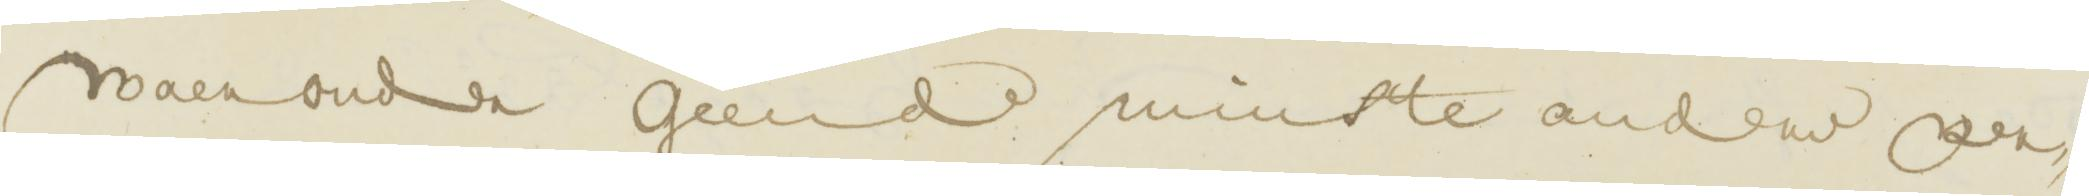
waeronder geende minste andere ver„
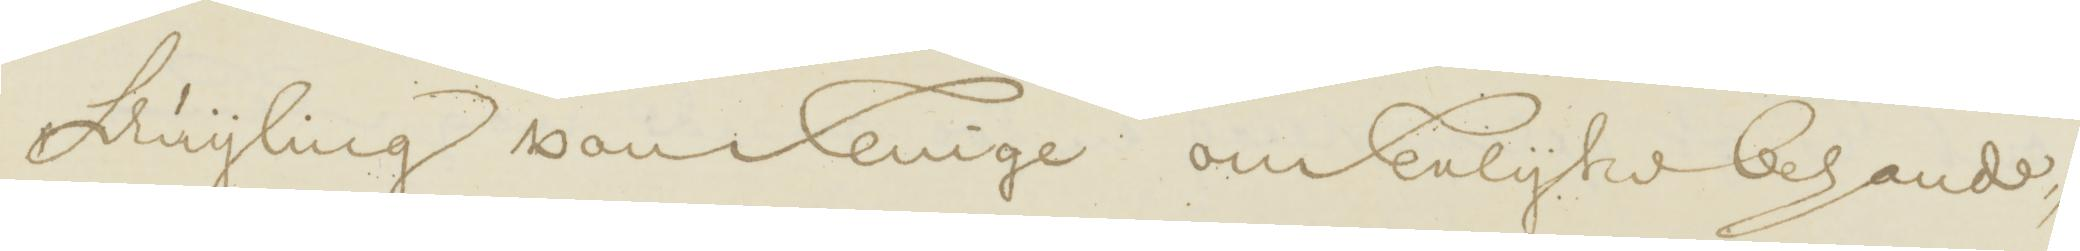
schuijling van Eenige onEerlijke behande„
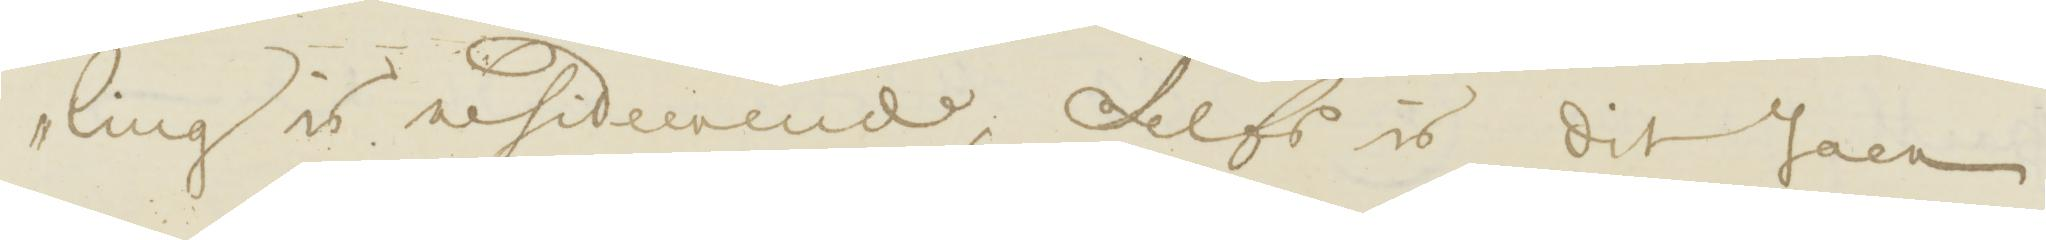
„ling is resideerende; selfs is dit Iaer
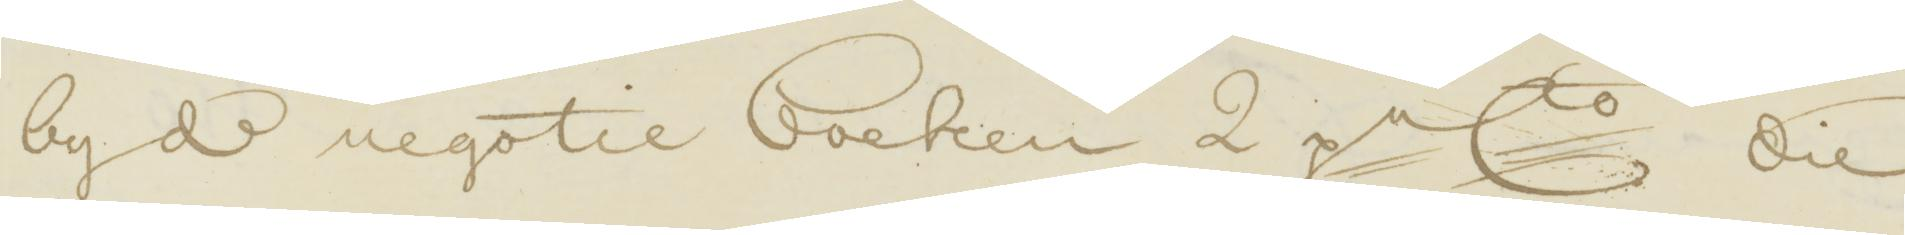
by de negotie boeken 2 p=r C=to die
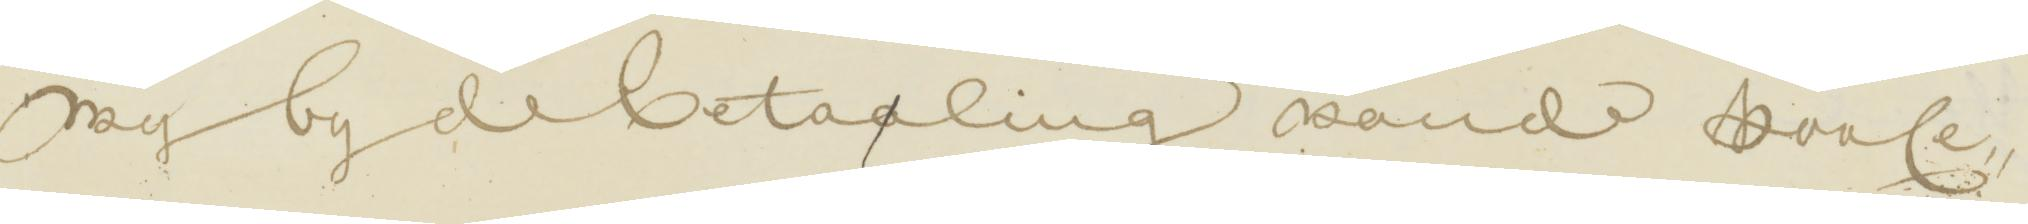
wy by de betaaling vande porce„
